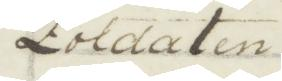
Zoldaten
